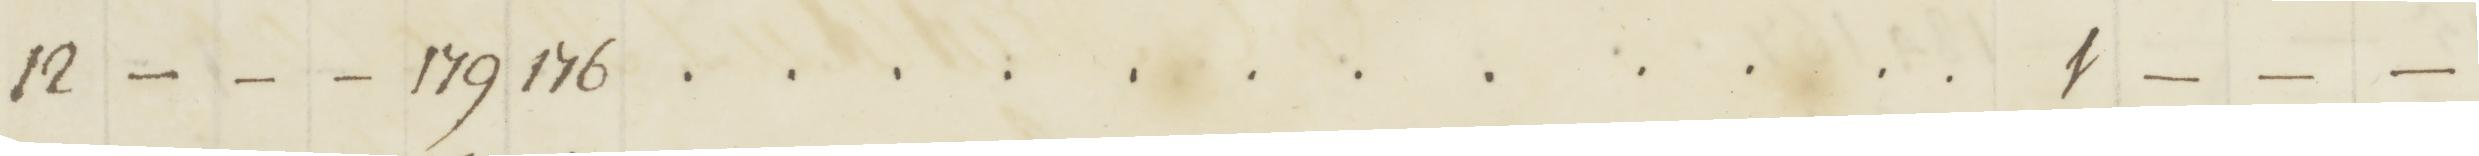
12 — — — 179 176 . . . . . . . . . . . . . 1 — — —
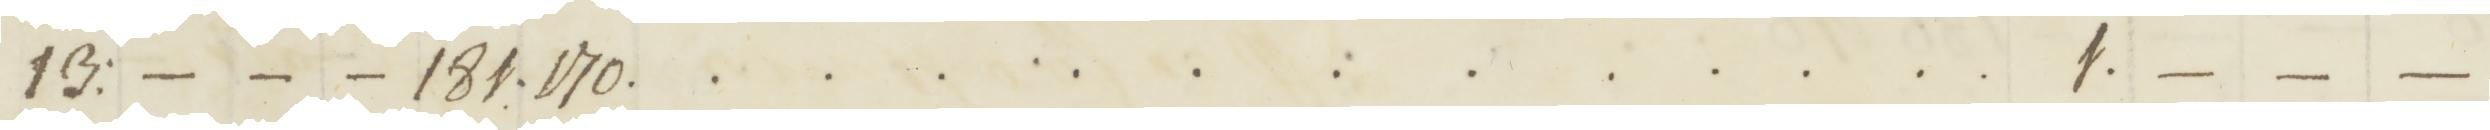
13: — — — 181:170. . . . . . . . . . . . . . 1. — — —
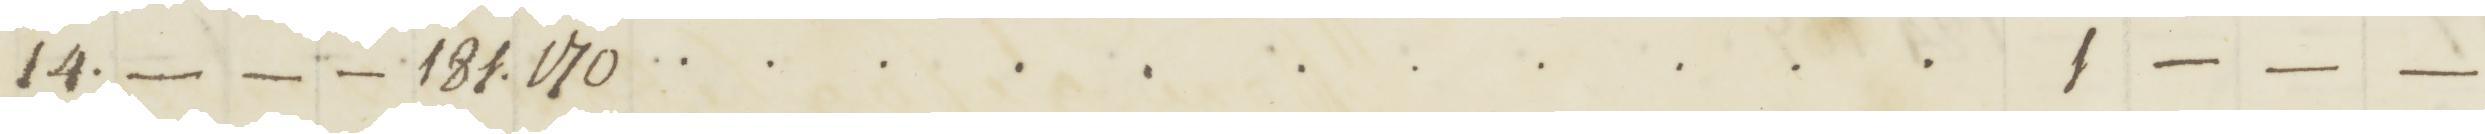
14. — — — 181.170 . . . . . . . . . . . . 1 — — —
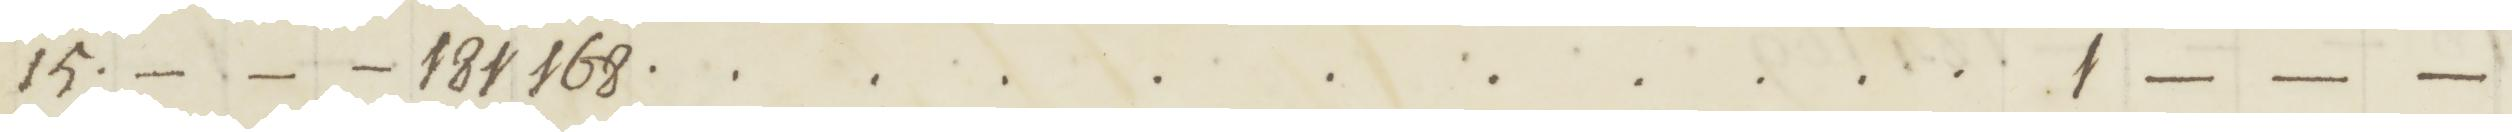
15. — — — 181 168. . . . . . . . . . . . . 1 — — —
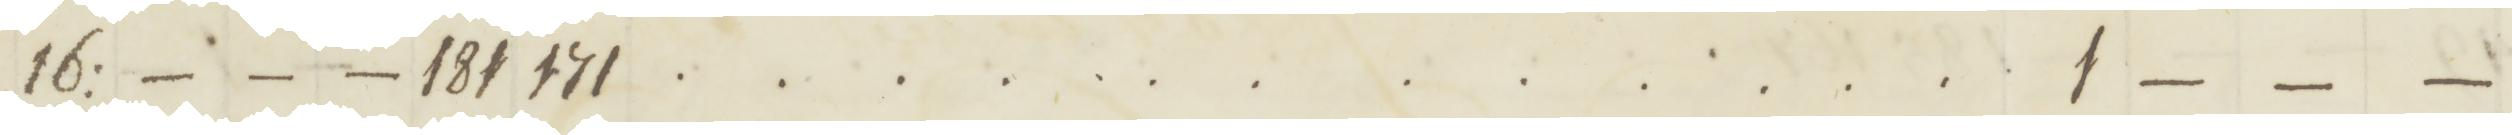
16: — — — 181 171 . . . . . . . . . . . . . 1 — — —
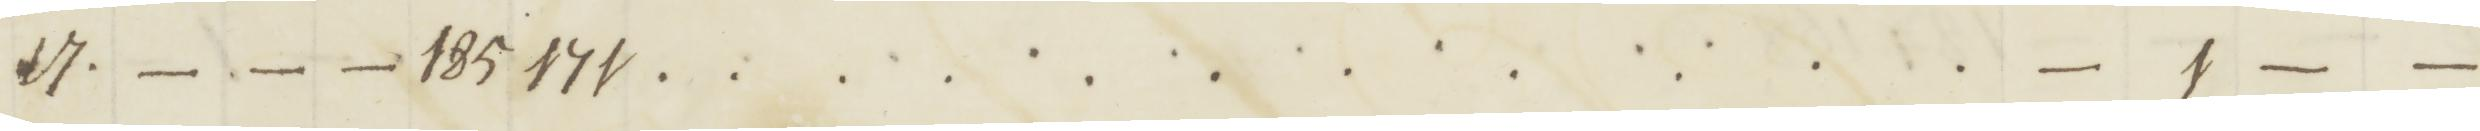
17. — — — 185 171. . . . . . . . . . . . — 1 — —
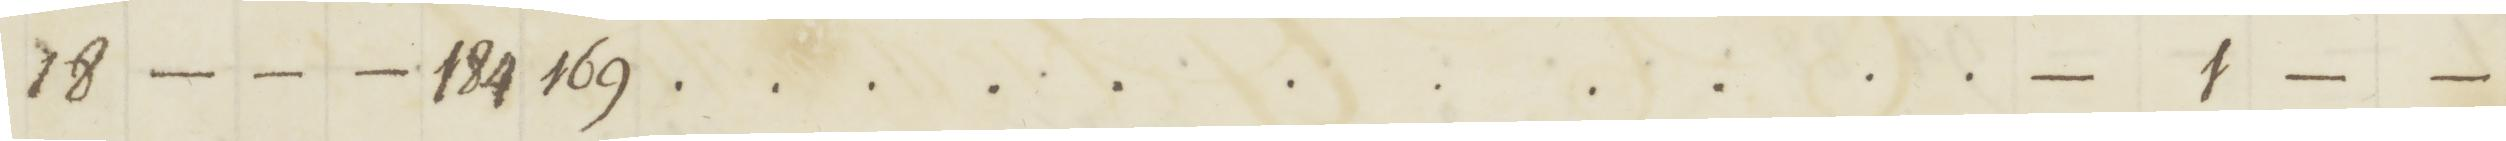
18 — — — 184 169 . . . . . . . . . . . . — 1 — —
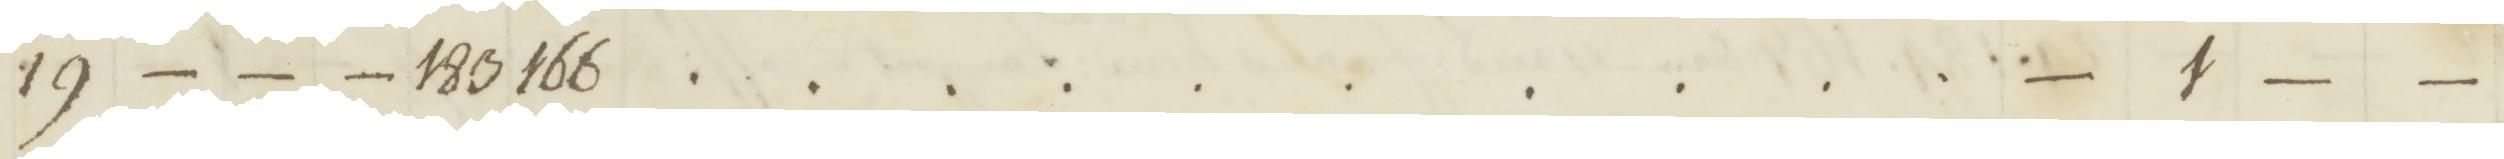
19 — — — 183 166 . . . . . . . . . . . — 1 — —
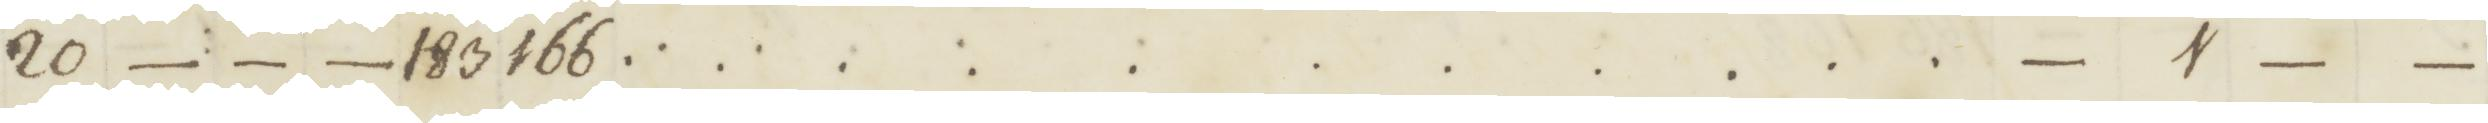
20 — — — 183 166 . . . . . . . . . . . — 1 — —
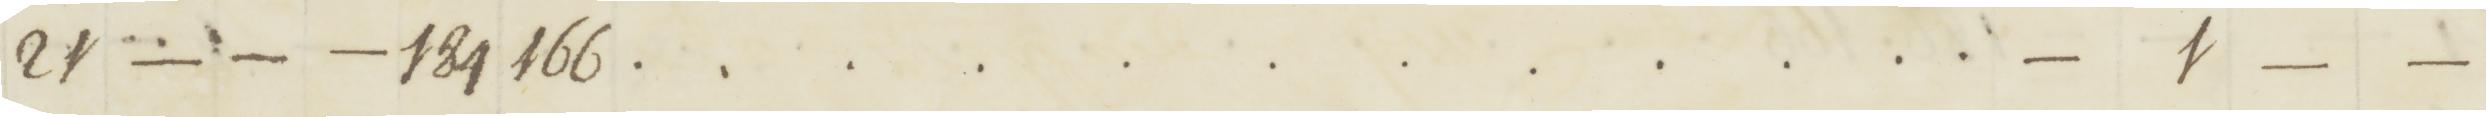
21 — — — 184 166 . . . . . . . . . . . . — 1 — —
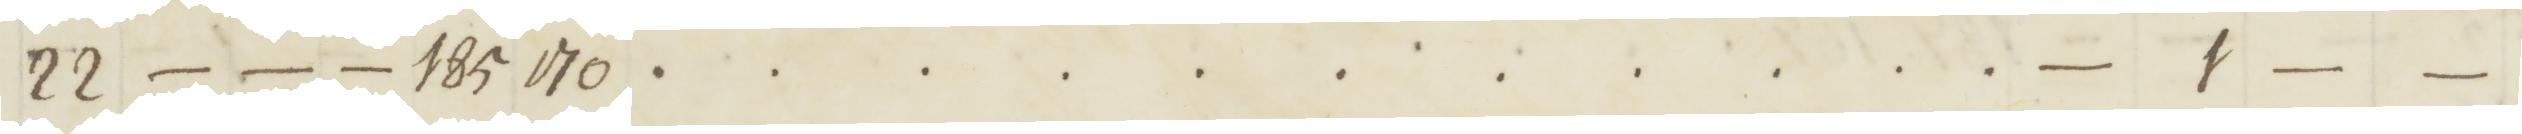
22 — — — 185 170 . . . . . . . . . . . . . — 1 — —
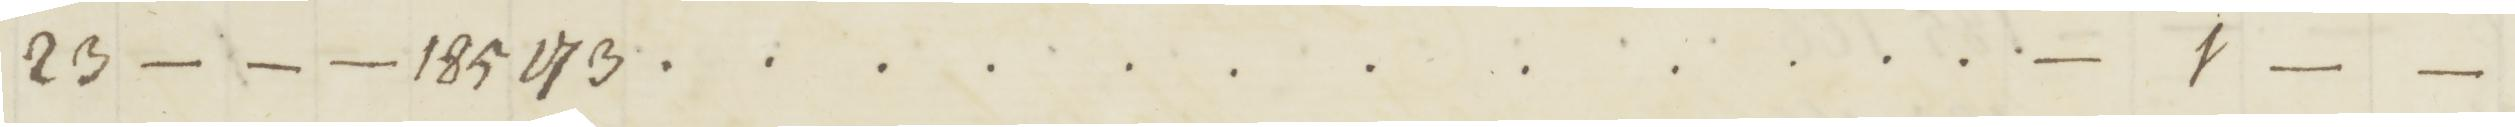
23 — — — 185 173 . . . . . . . . . . . . . — 1 — —
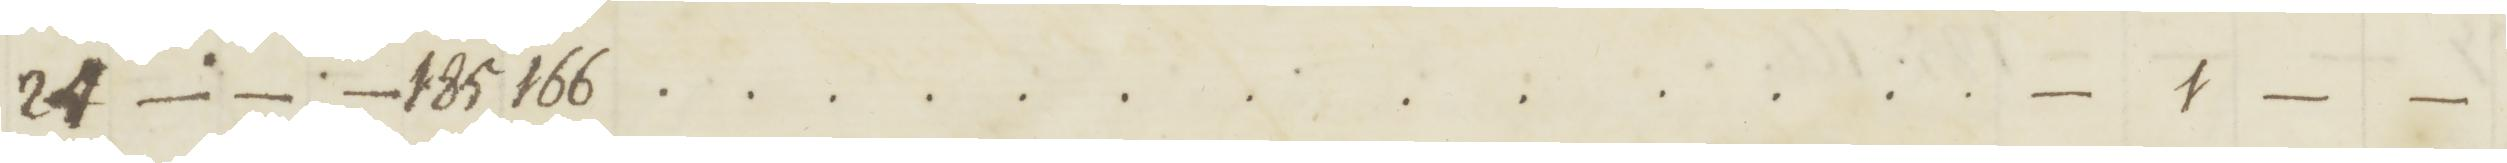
24 — — — 185 166 . . . . . . . . . . . . . .— 1 — —
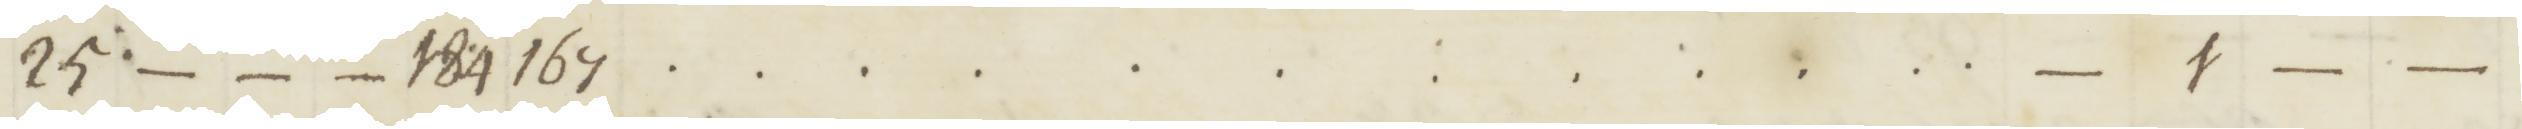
25 — — — 184 167 . . . . . . . . . . . . . . — 1 — —
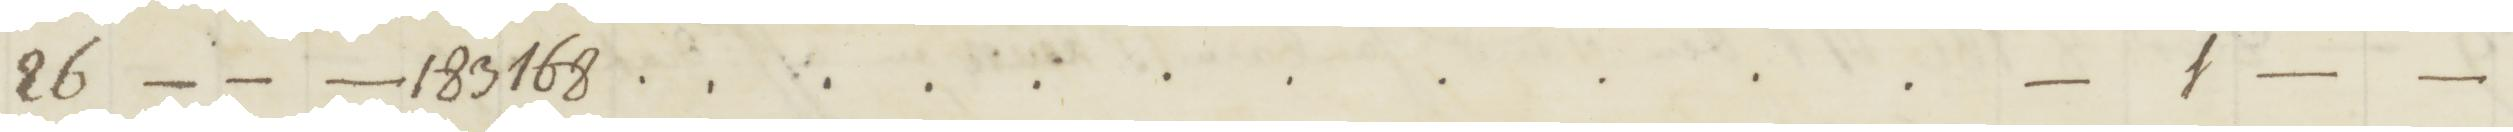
26 — — — 183 168 . . . . . . . . . . . . . . — 1 — —
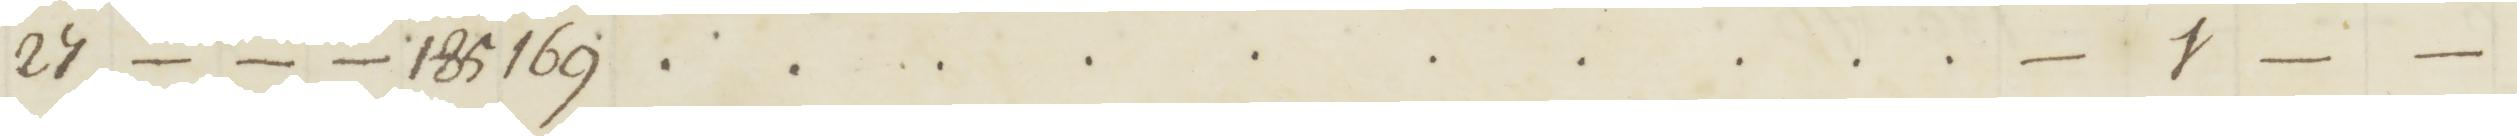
27 — — — 185 169 . . . . . . . . . . . . . . — 1 — —
